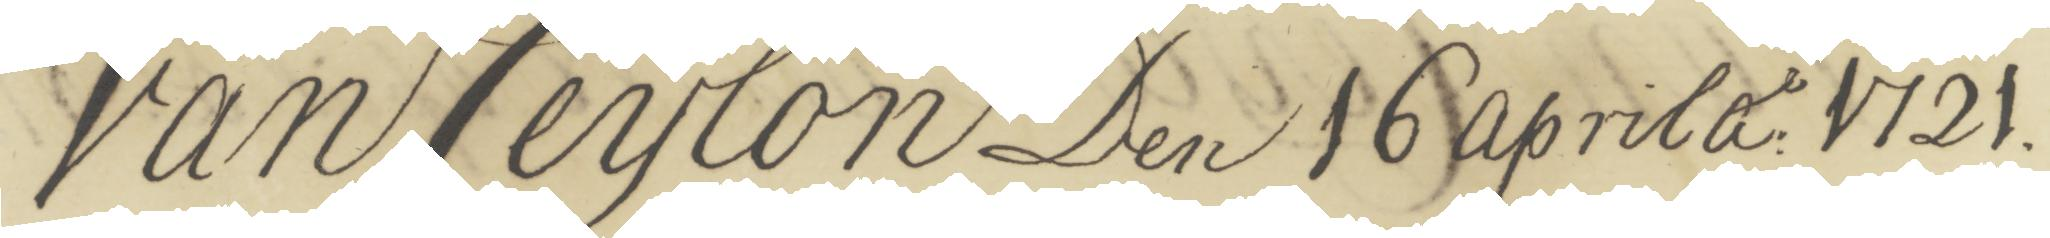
van Ceijlon Den 16 april a:o 1721.
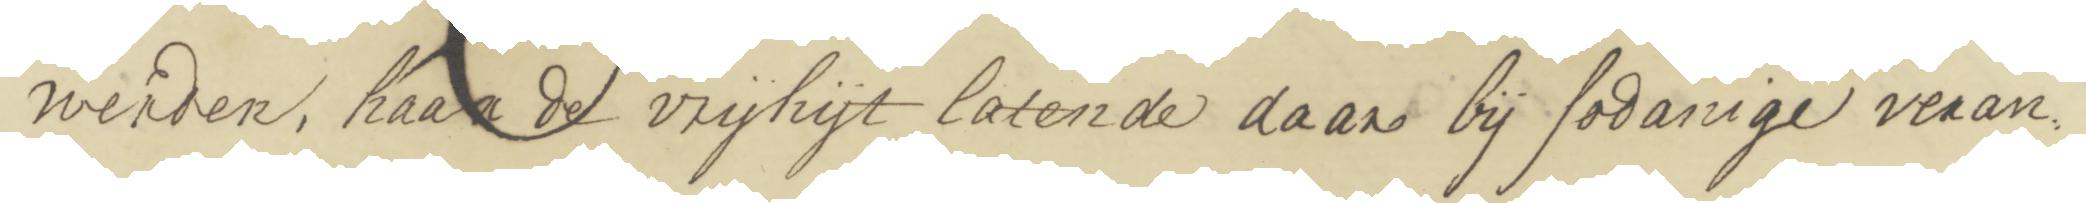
werden, haar de vrijhijt latende daar bij sodanige veran„
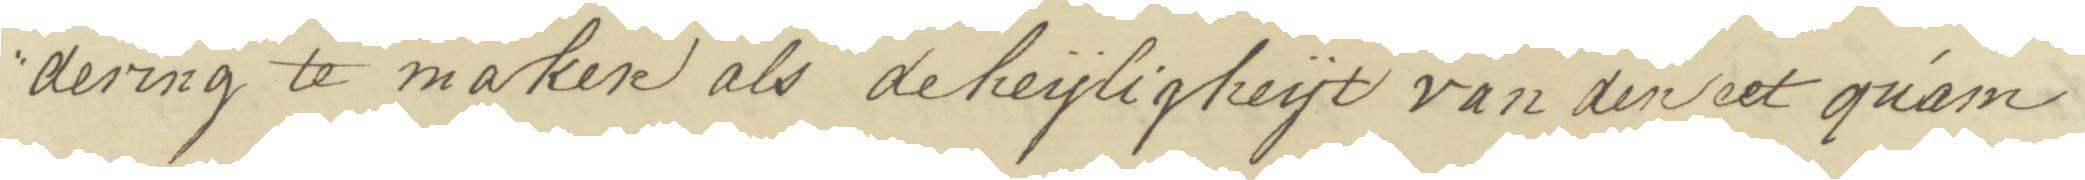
„dering te maken als de heijligheijt van den eet quam
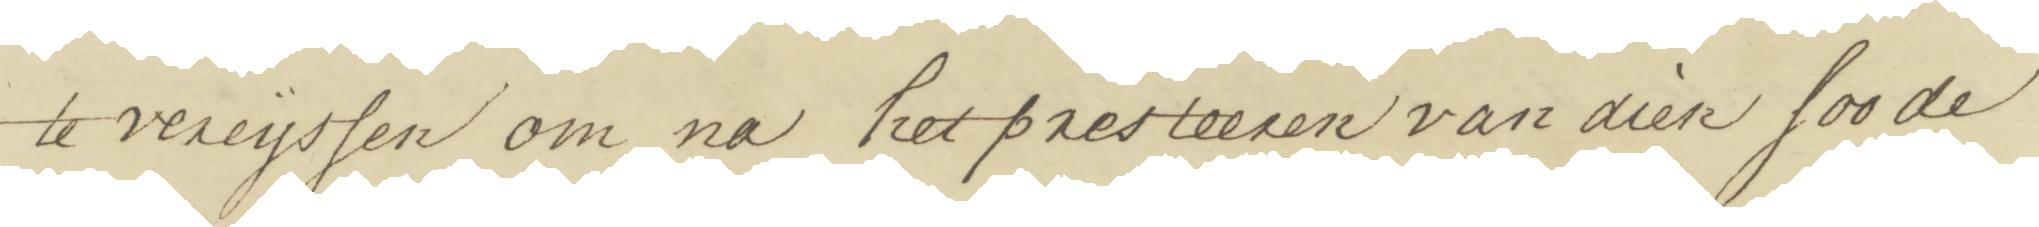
te vereijssen om na het presteeren van dien soo de
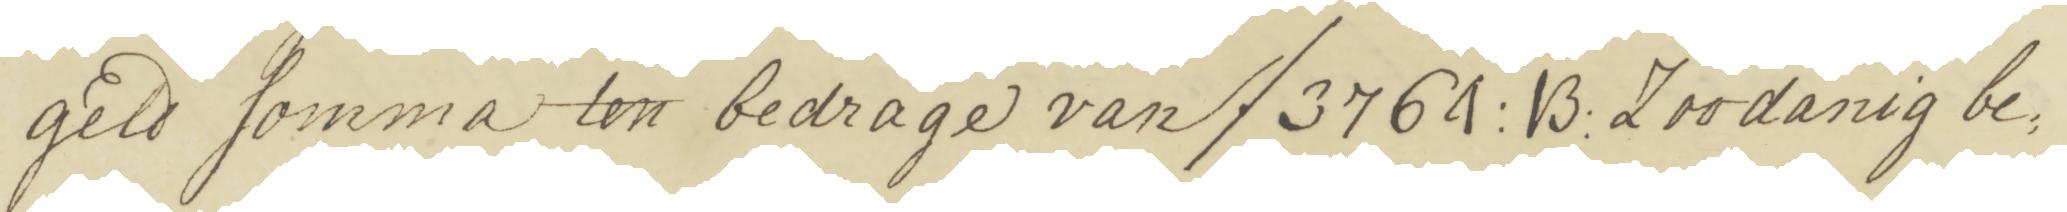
geld somma ten bedrage van ƒ3764:13: zoodanig be„
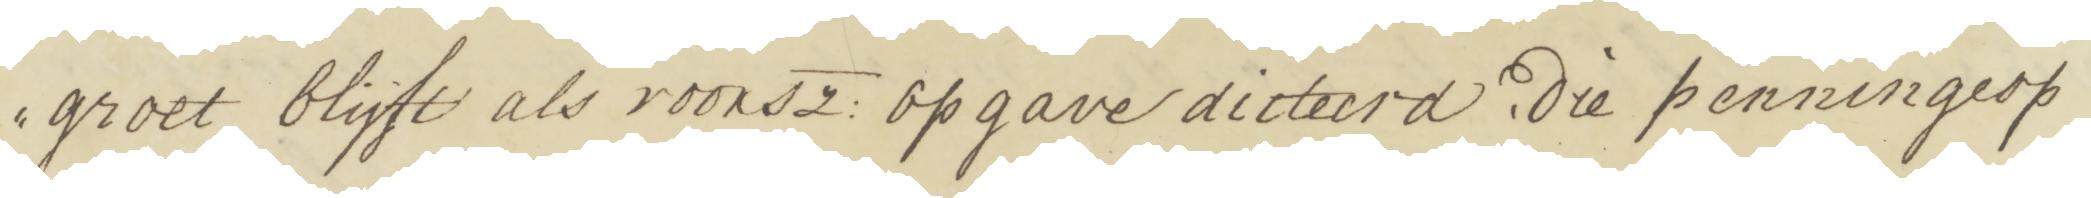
„groet blijft als voorsz: opgave dicteerd, die penninge op
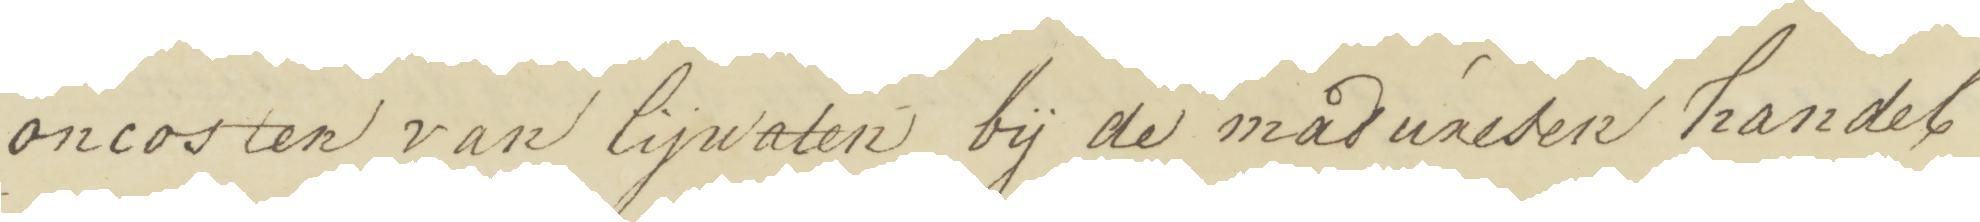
oncosten van lijwaten bij de maduresen handel
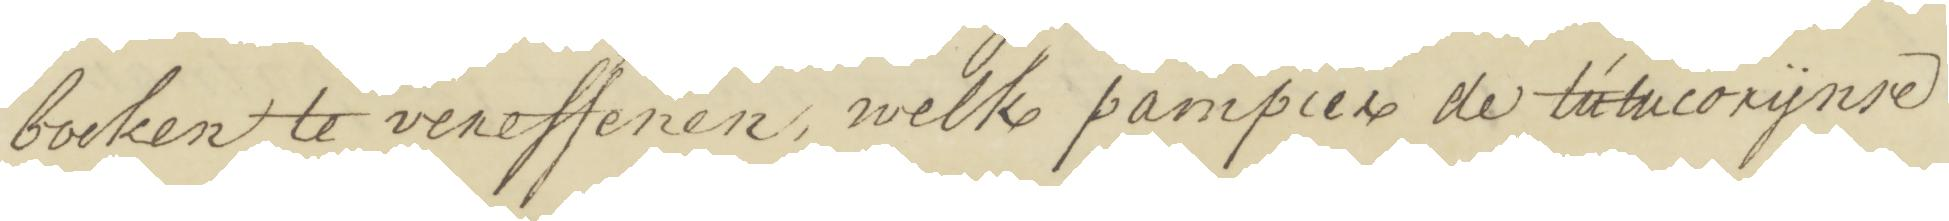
boeken te vereffenen, welk pampier de tutucorijnse
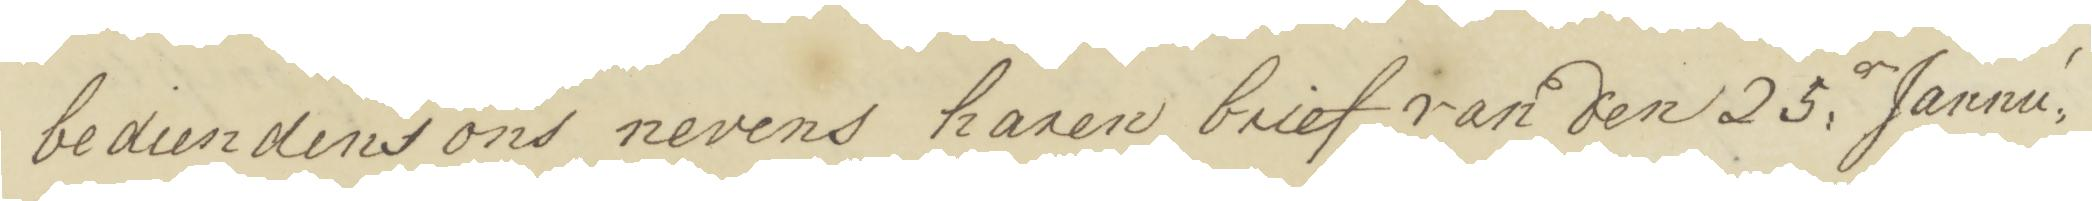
bediendens ons nevens haren brief van den 25:e Jannu„
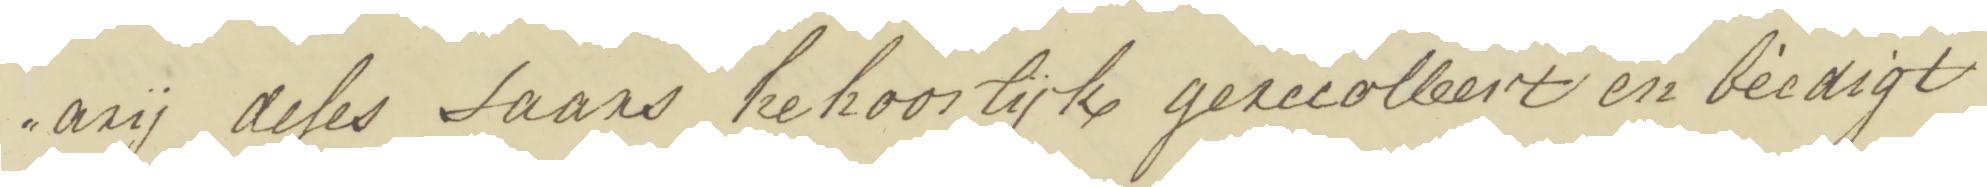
„arij deses Iaars behoorlijk gerecolleert en be'edigt
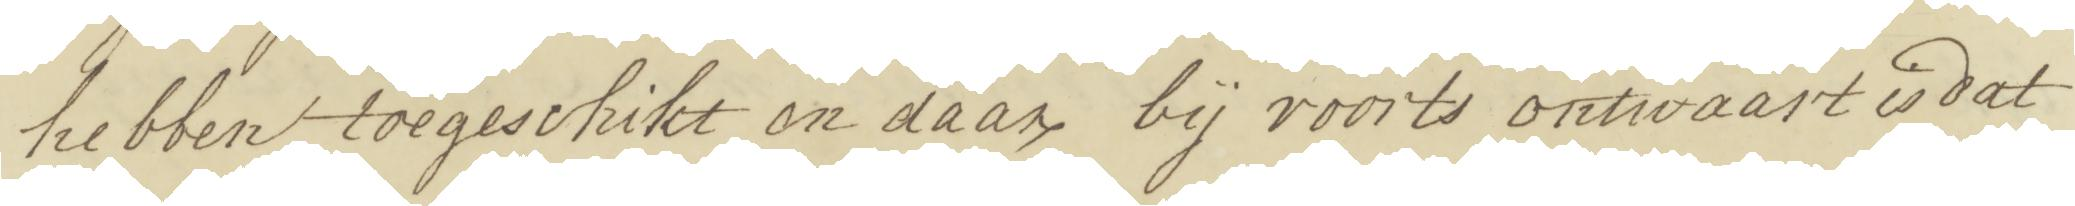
hebben toegeschikt en daar bij voorts ontwaart is dat
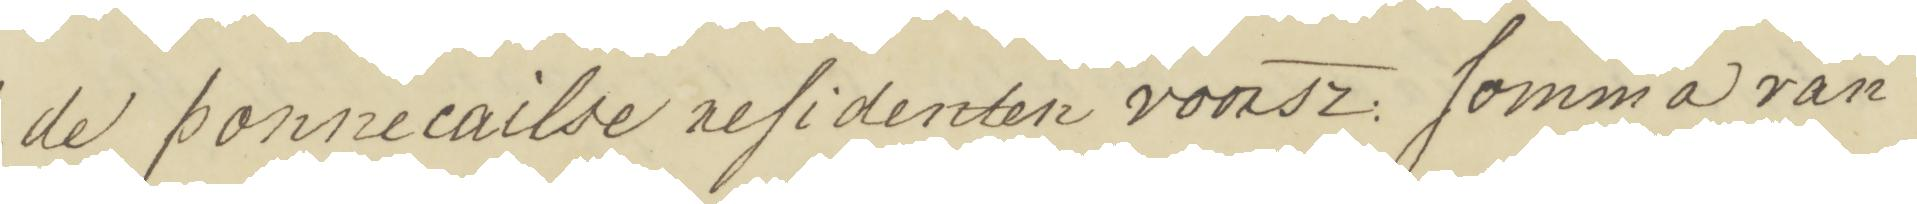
de ponnecailse residenten voorsz: somma van
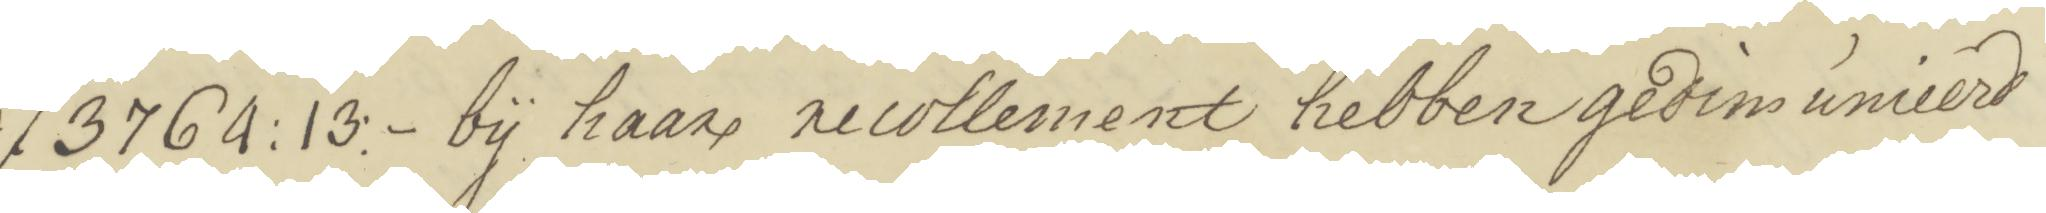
ƒ3764:13:— bij haar recollement hebben gedimunieerd
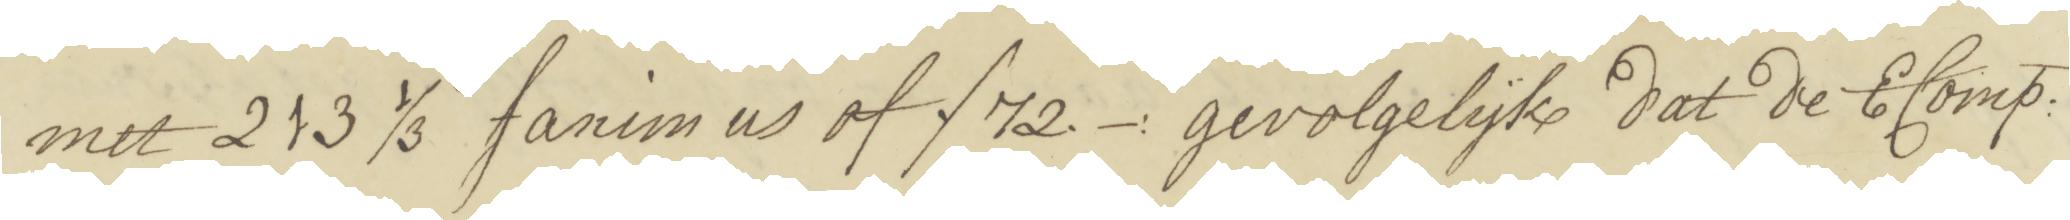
met 213 1/3 fanim us of ƒ72.–: gevolgelijk dat de EComp:
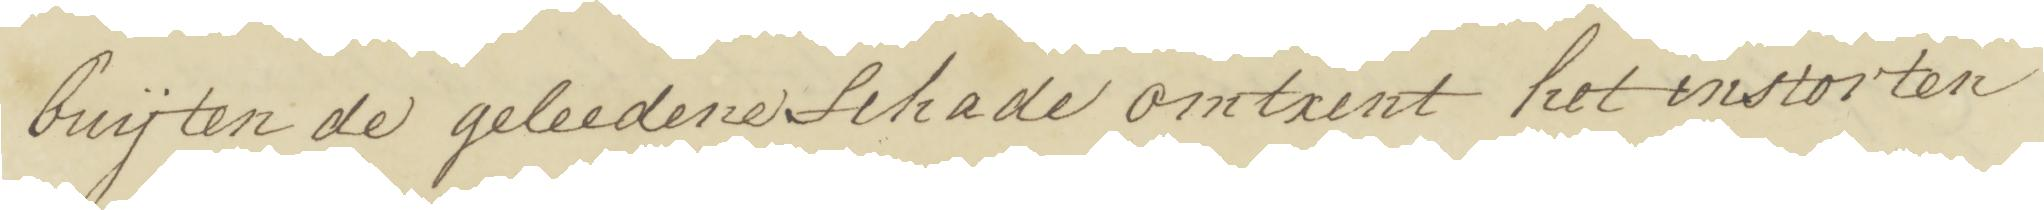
buijten de geleedene schade omtrent het instorten
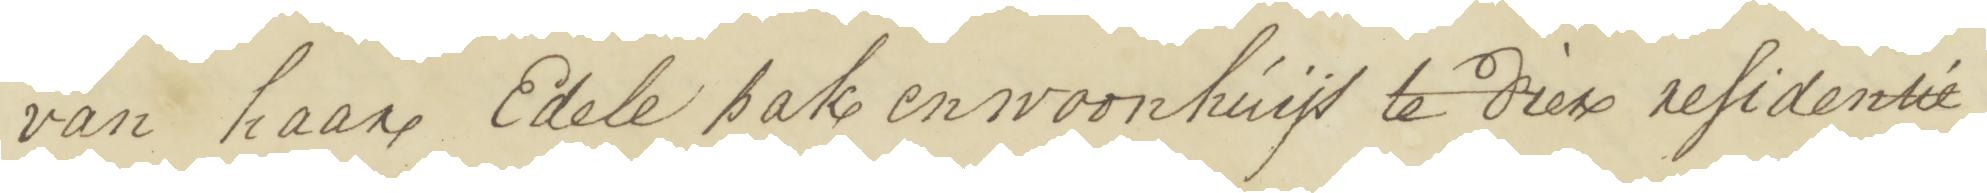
van haar Edele pak en woonhuijs te dier residentie
